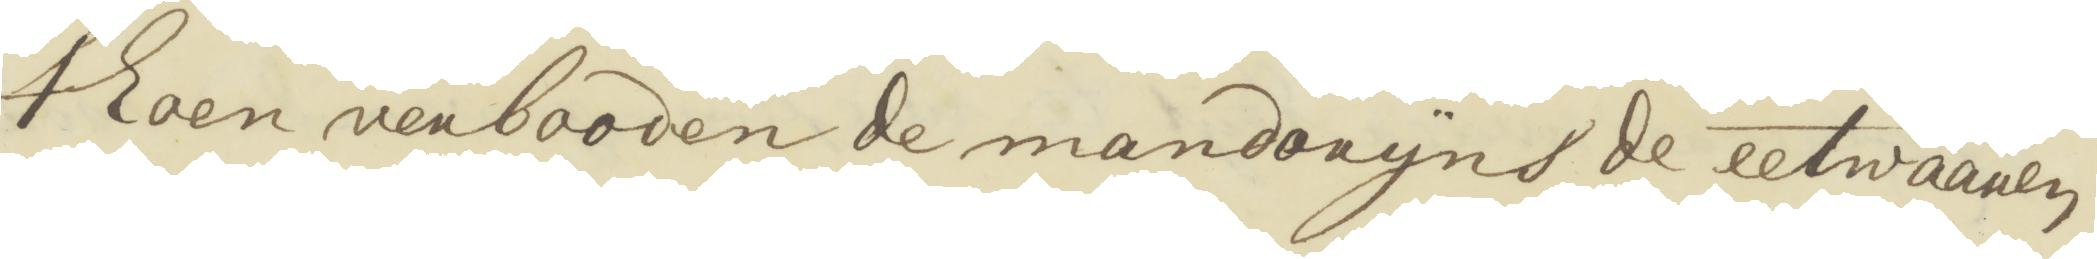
thoen verbooden de mandarijns de eetwaaren
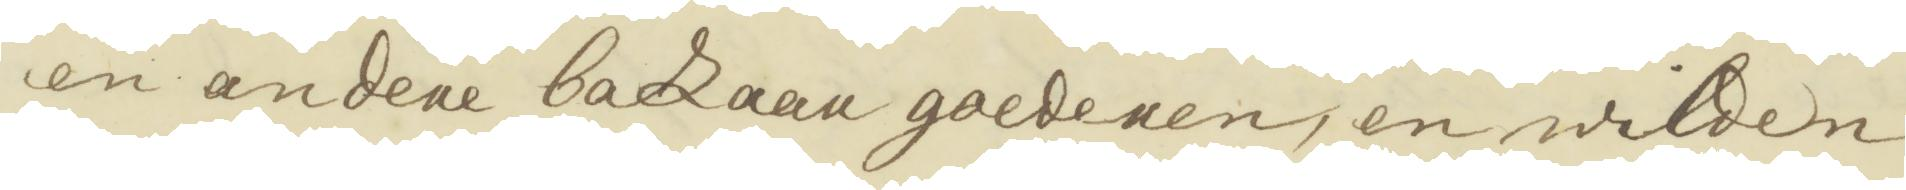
en andere bazaar goederen, en wilden
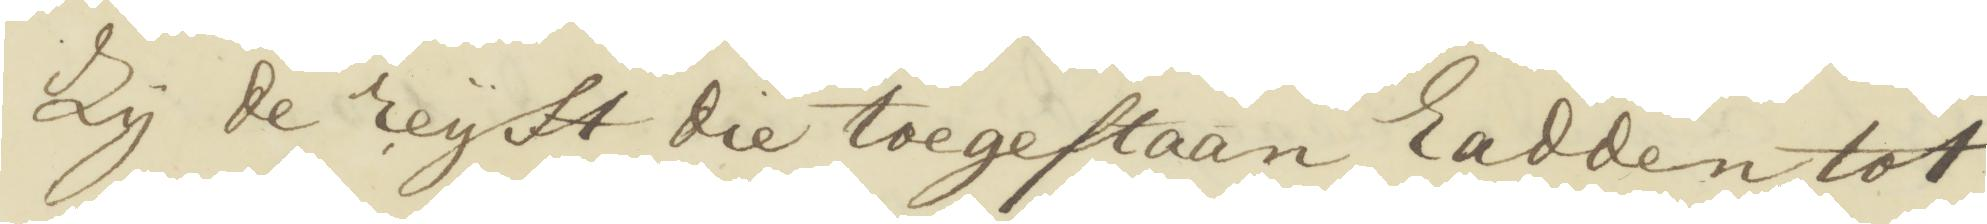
Zij de reijst die toegestaan hadden tot
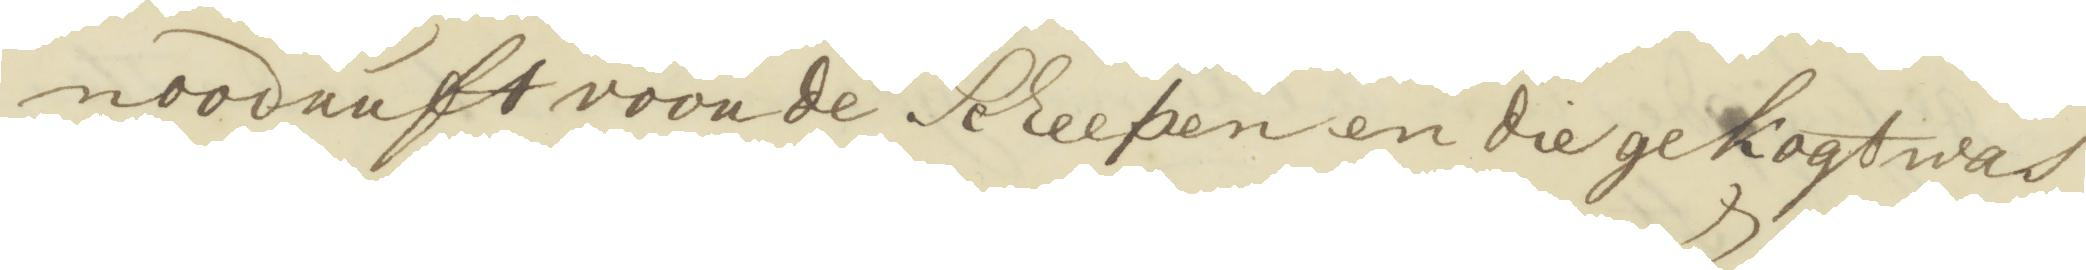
noodruft voor de scheepen en die gekogt was
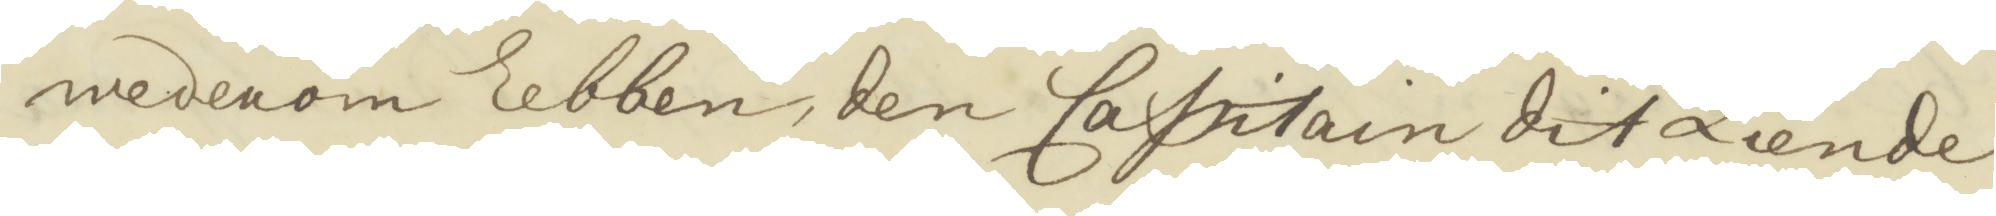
wederom hebben, den Capitain dit Ziende
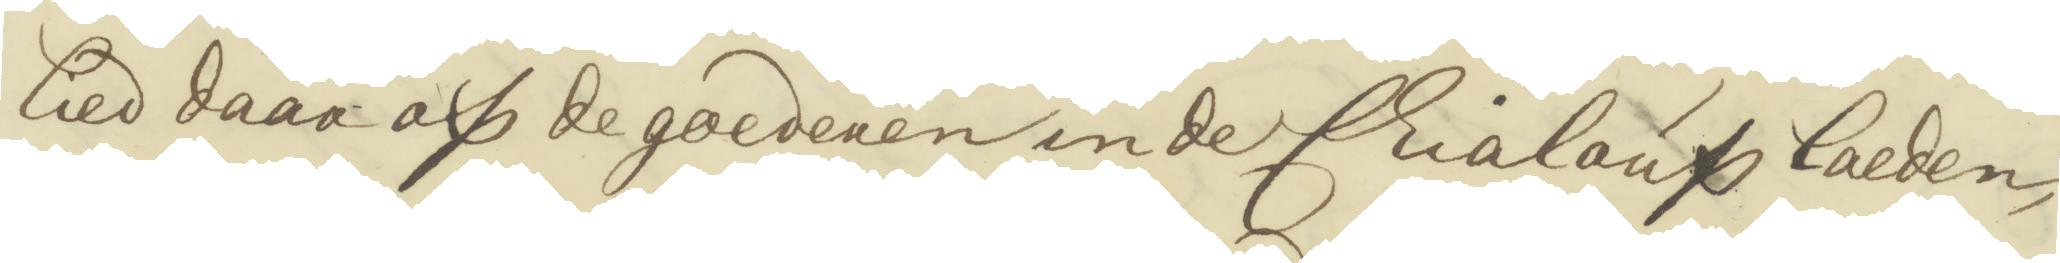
lied daar op de goederen in de Chialoup laeden
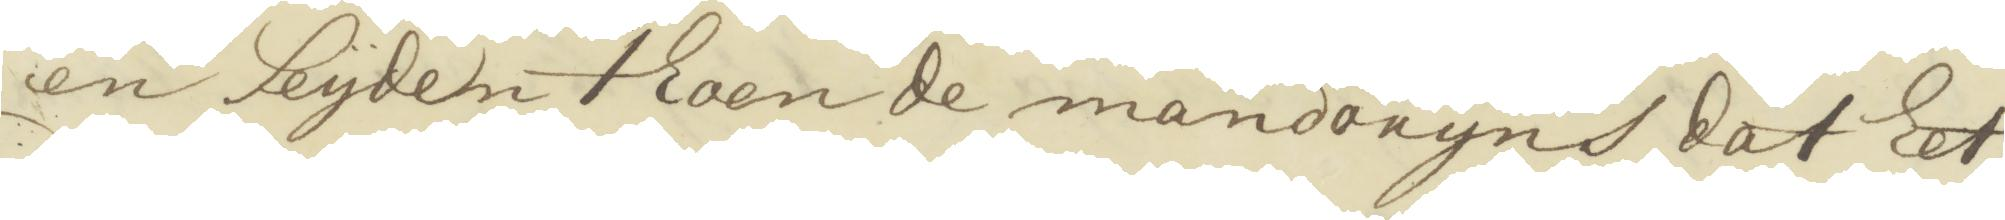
en seijden thoen de mandarijns dat het
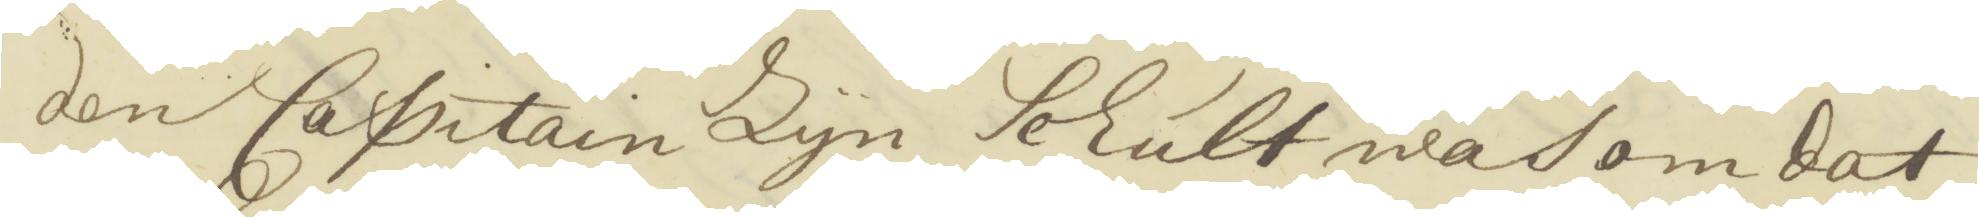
den Capitain Zijn schult was om dat
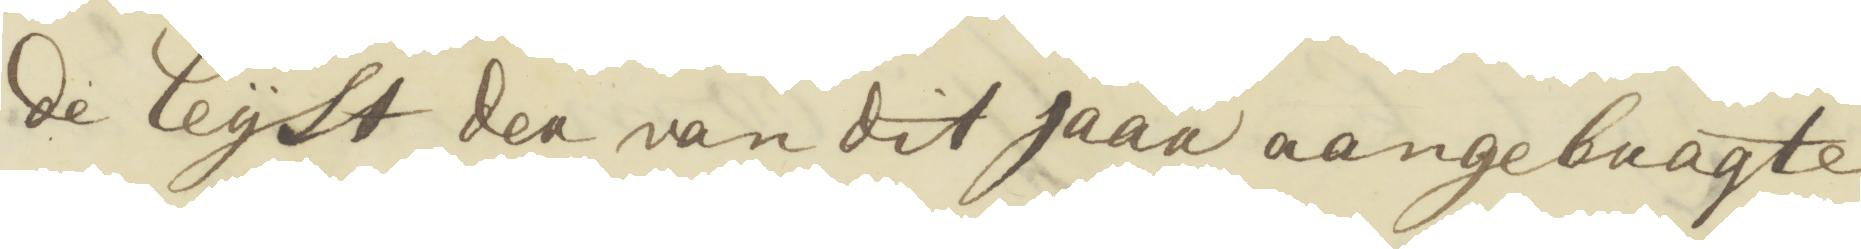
de leijst der van dit jaar aangebragte
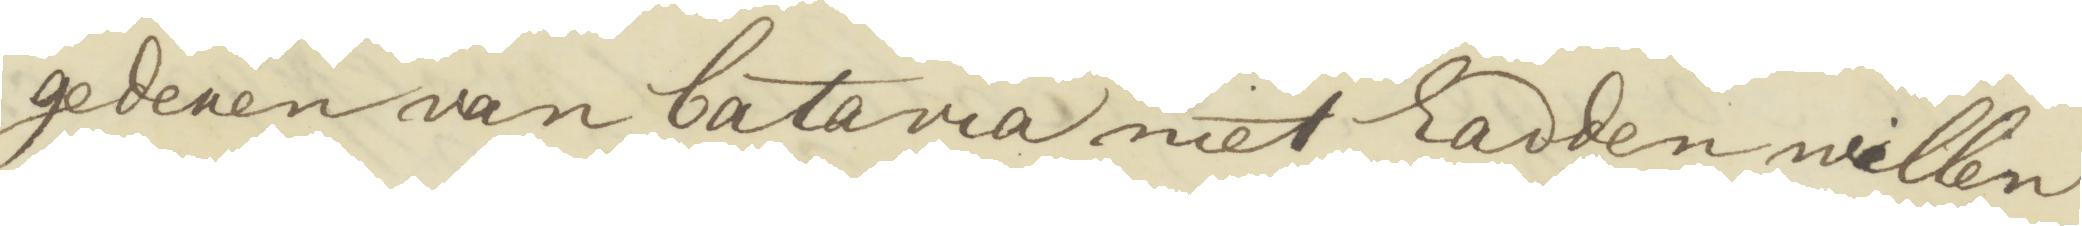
gederen van batavia niet hadden willen
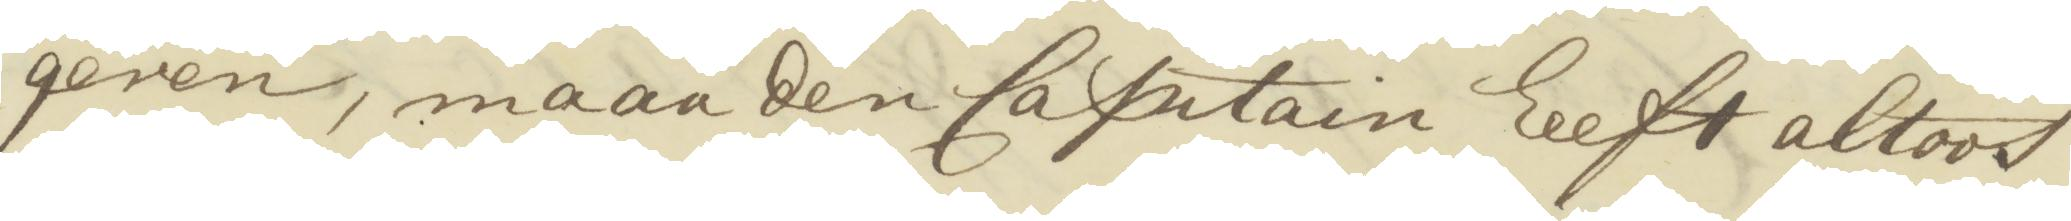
geven, maar den Capitain heeft altoos
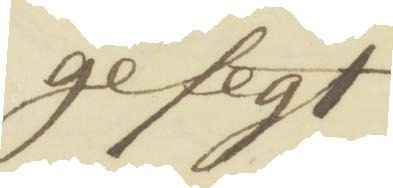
gesegt
